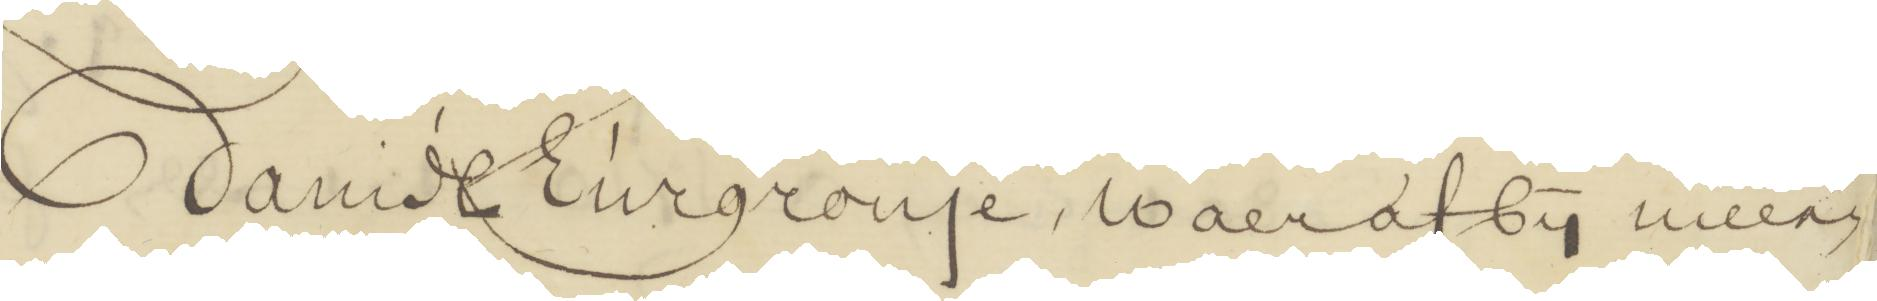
Daniél hurgronje, waer af bij meer,
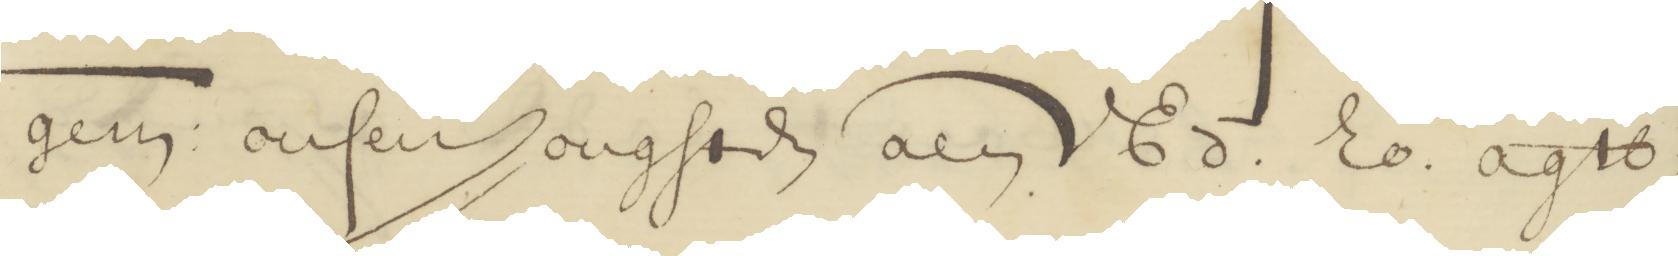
gem: onsen Jongsten aen UEd: ho. agtb
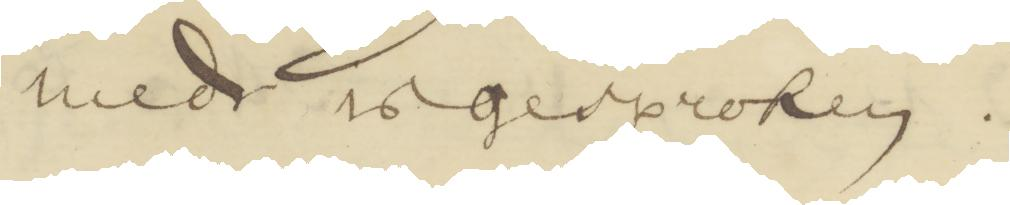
mede is gesproken.
